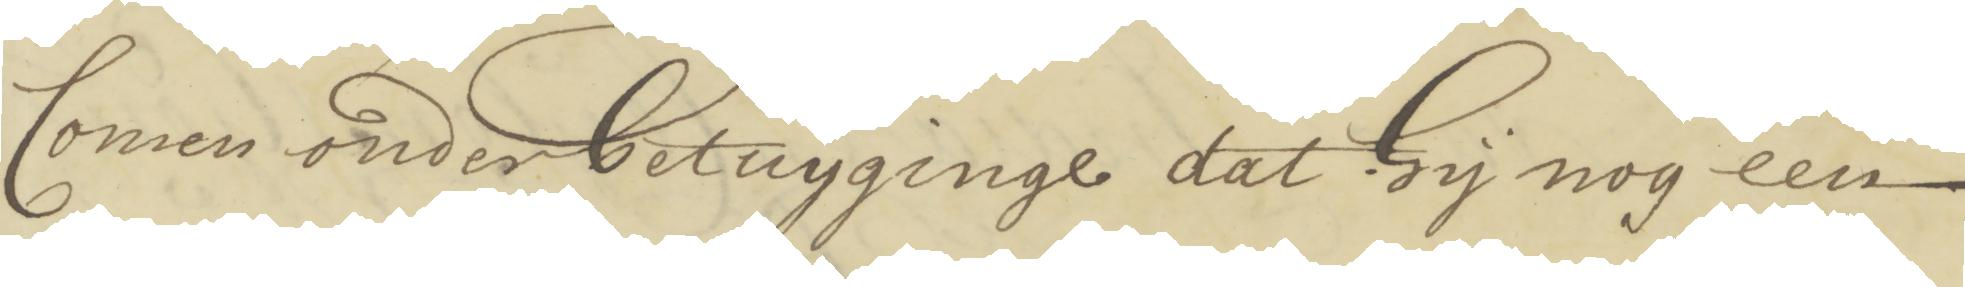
Comen onder betuyginge dat hij nog een
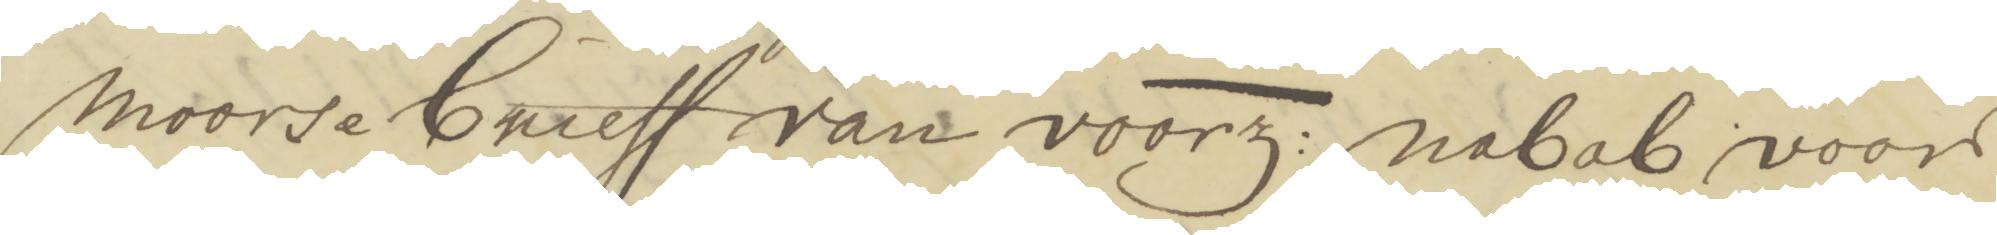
moorse brieff van voorz: nabab voor
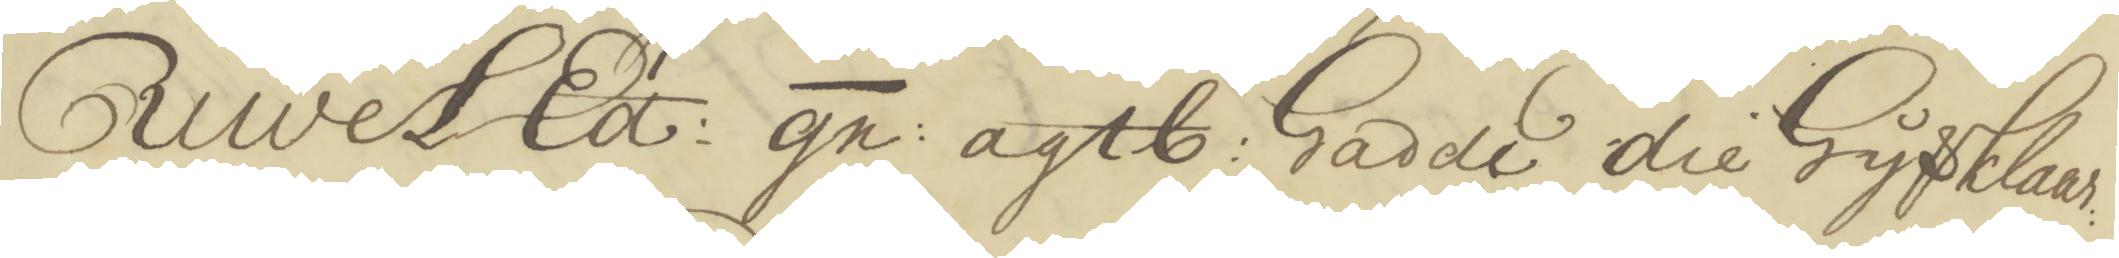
Uwel Ed: gr: agtb: hadde die hij verklaar:
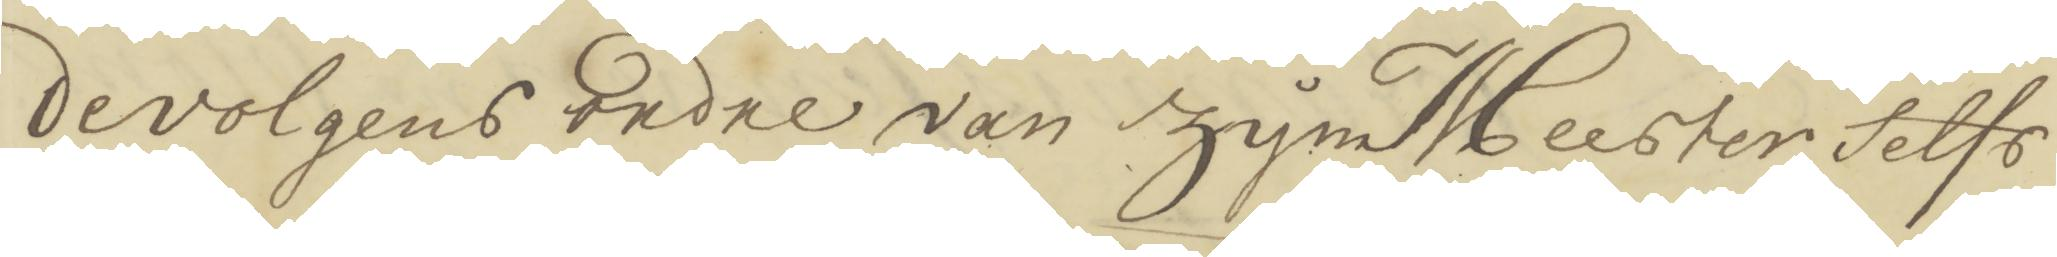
de volgens ordre van zijn Meester selfs
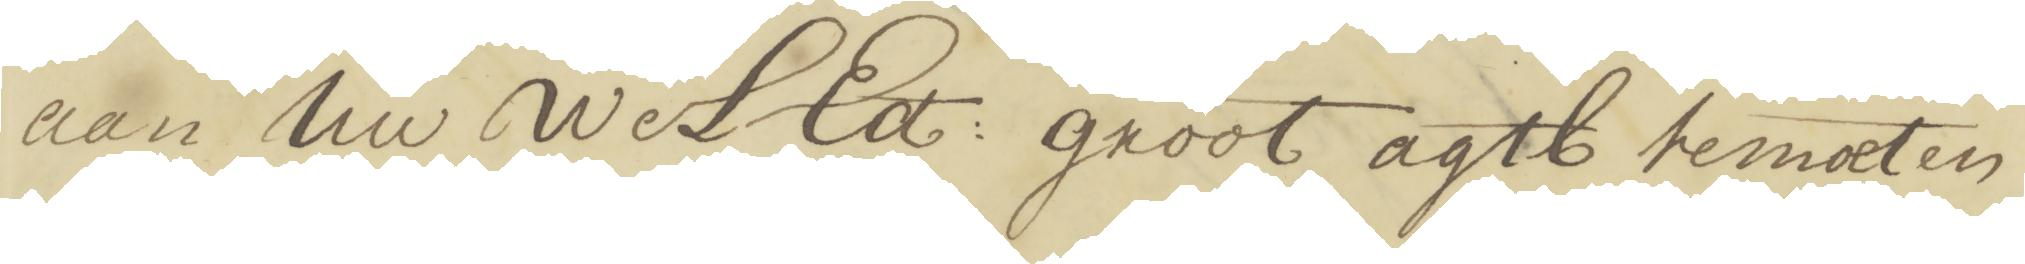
aan uw wel Ed: groot agtb te moeten
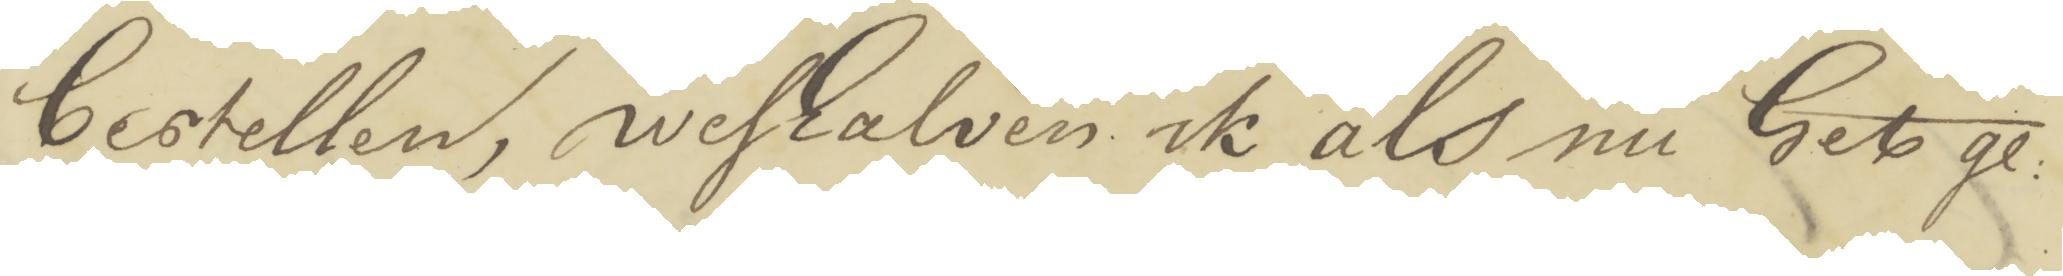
bestellen, weshalven ik als nu het ge:
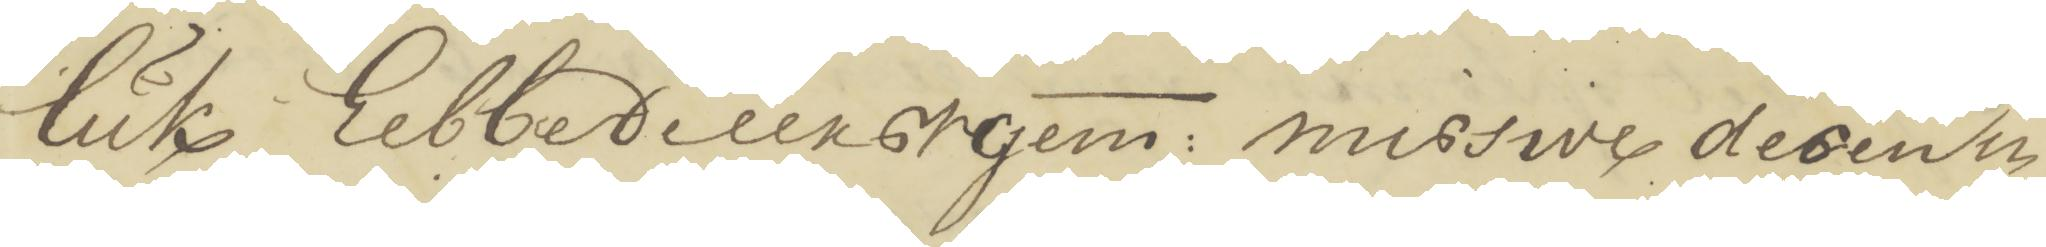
luk hebbe de eerst gem: missive desen in
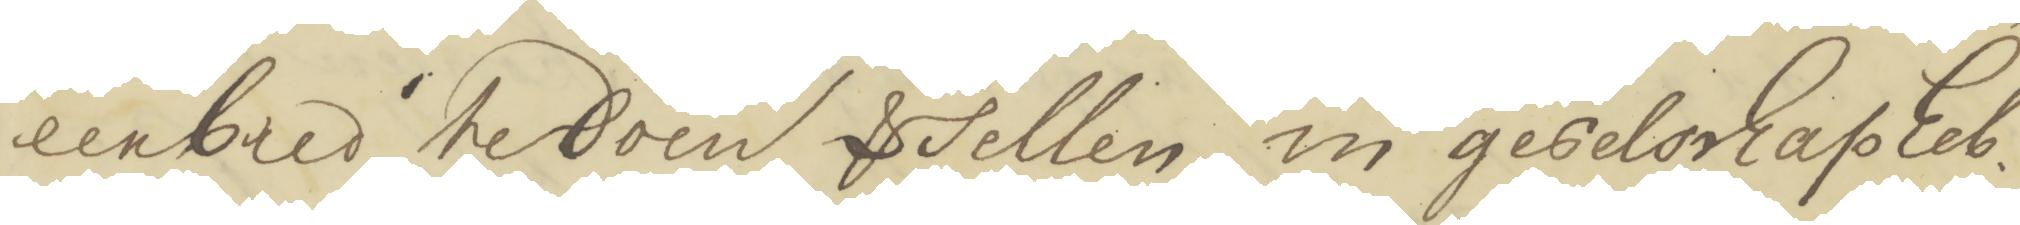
eerbied te doen versellen, in geselschap heb.
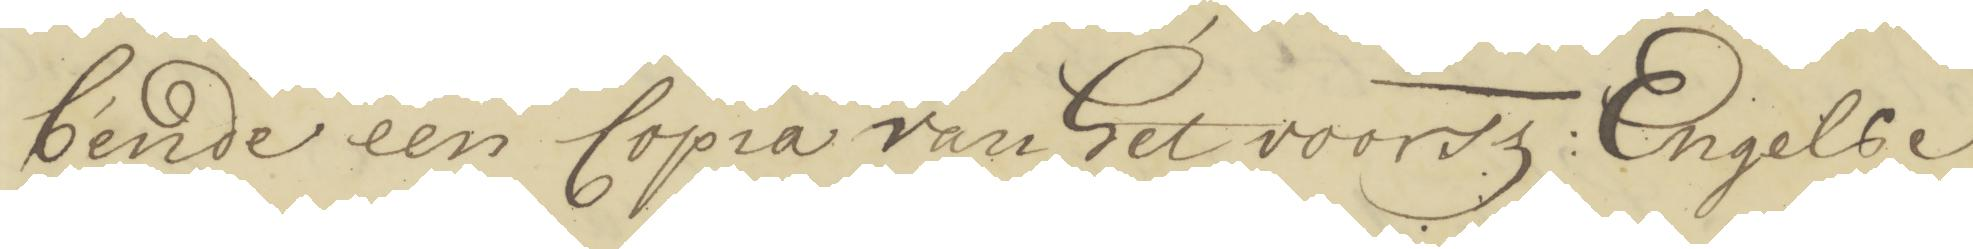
bende een Copia van het voorsz: Engelse
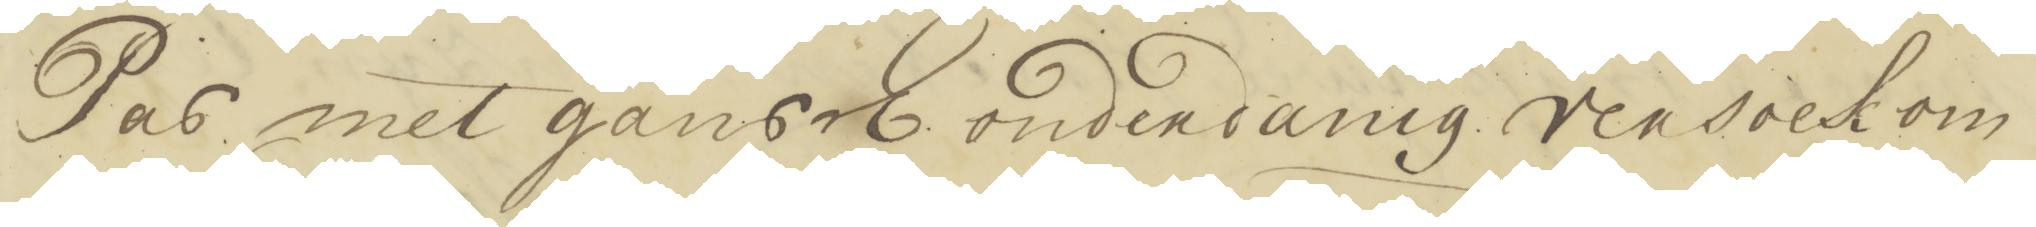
Pas met gansch onderdanig versoek om
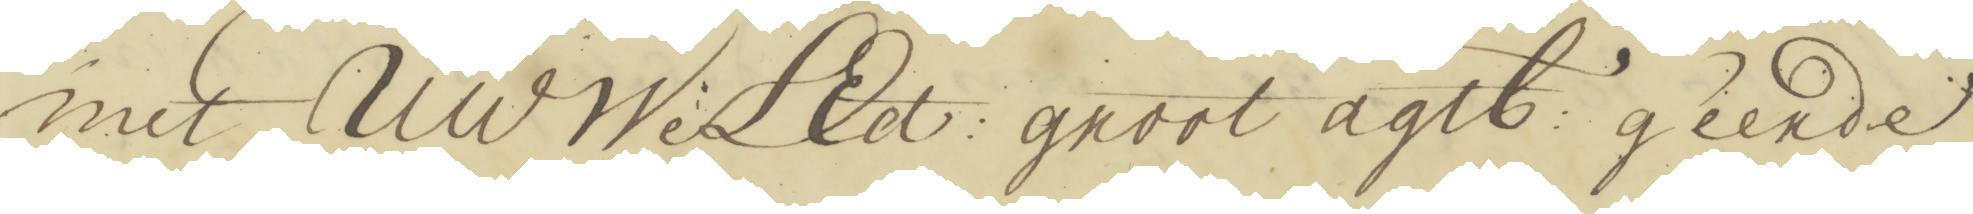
met Uw Wel Ed: groot agtb: g’eerde
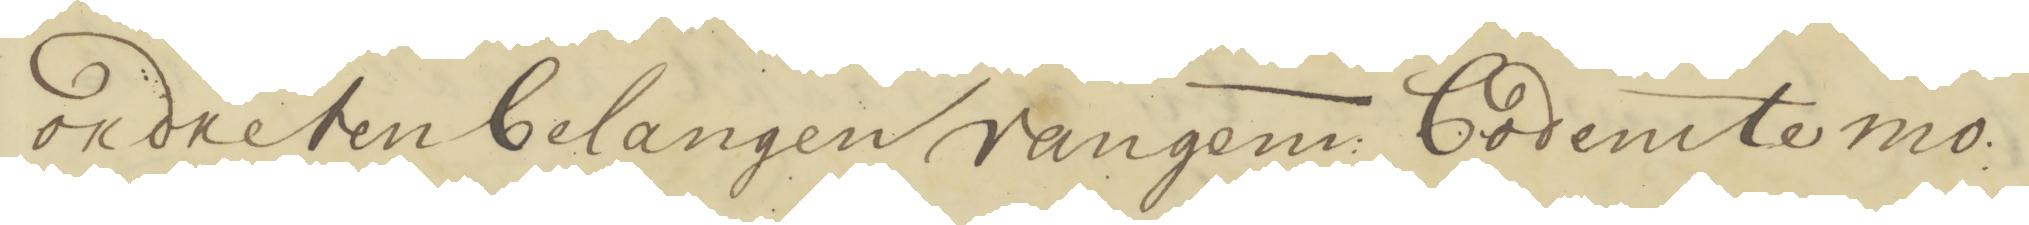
ordre ten belangen van gem: bodem te mo:
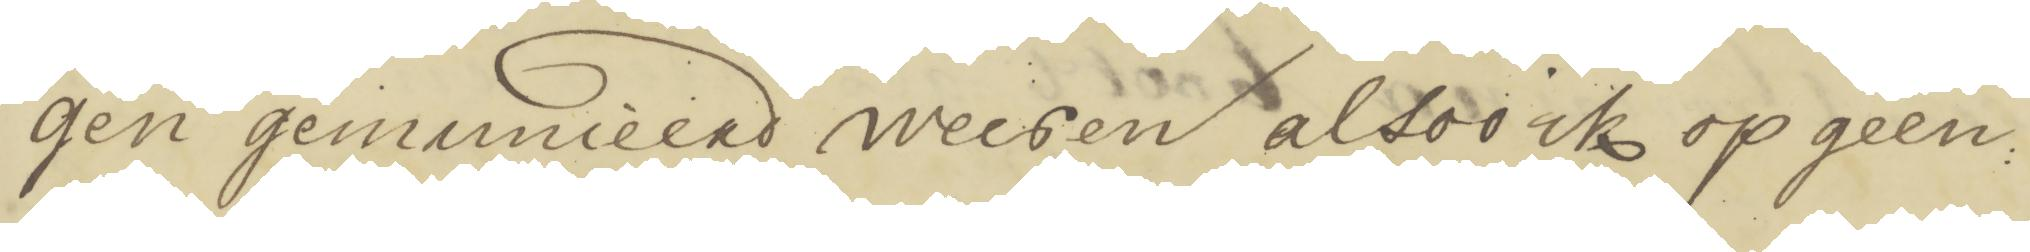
gen geinunieerd weesen alsoo ik op geen:
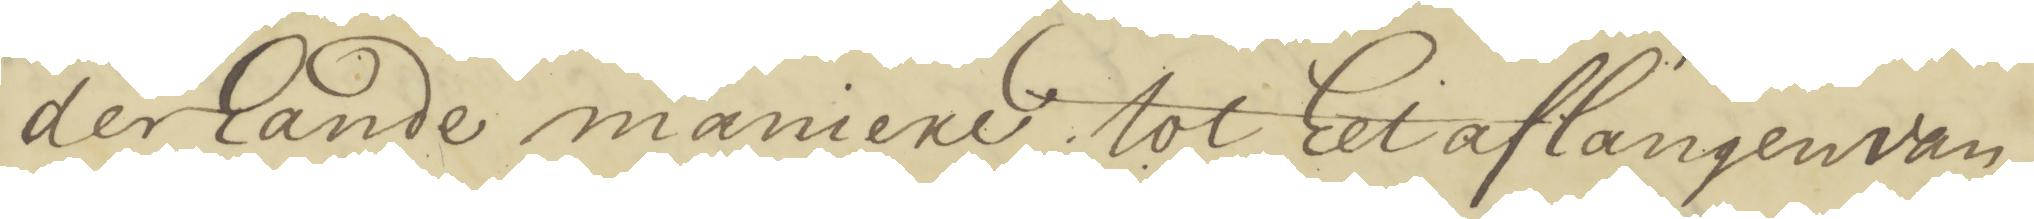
derhande maniere tot het aflangen van
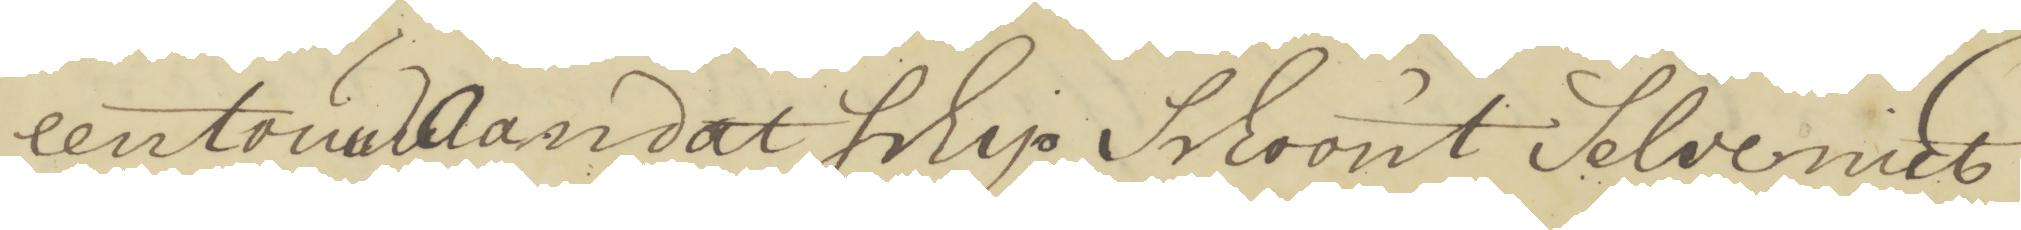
een touw aan dat schip schoon't selve niet
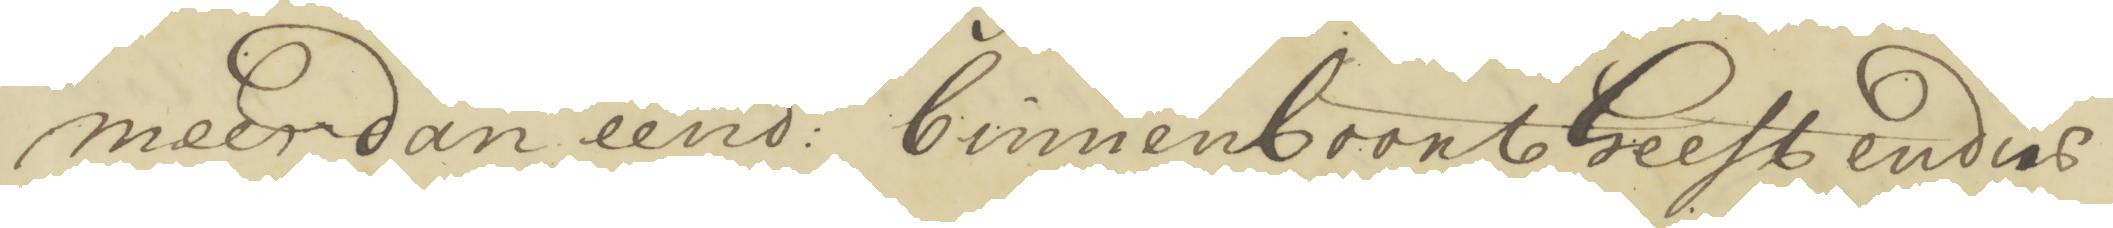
meer dan eend:e binnenboort heeft endus
